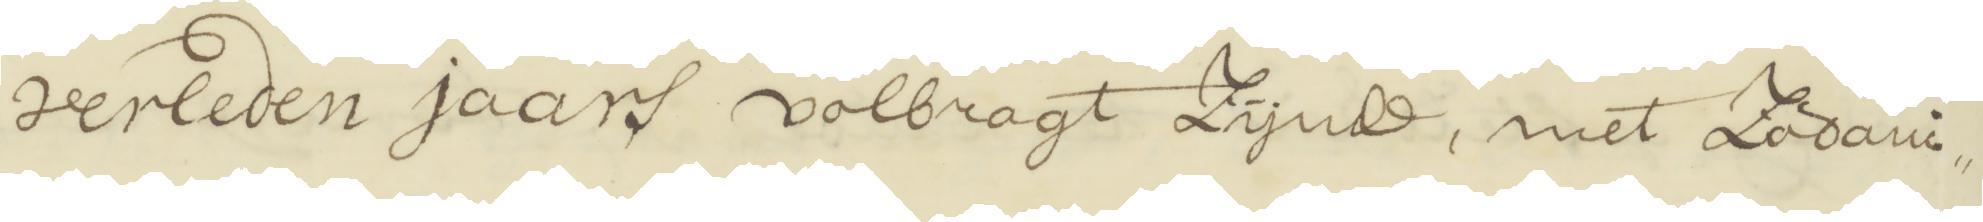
verleden jaars volbragt zijnde, met zodani„
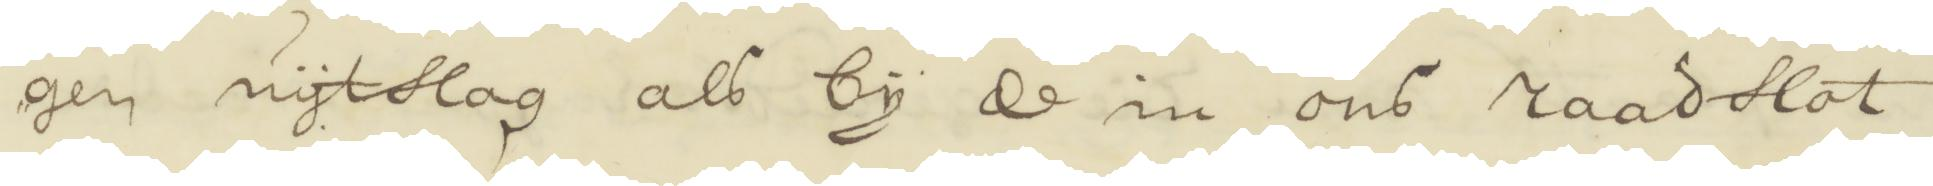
„gen uijtslag als bij de in ons raadslot
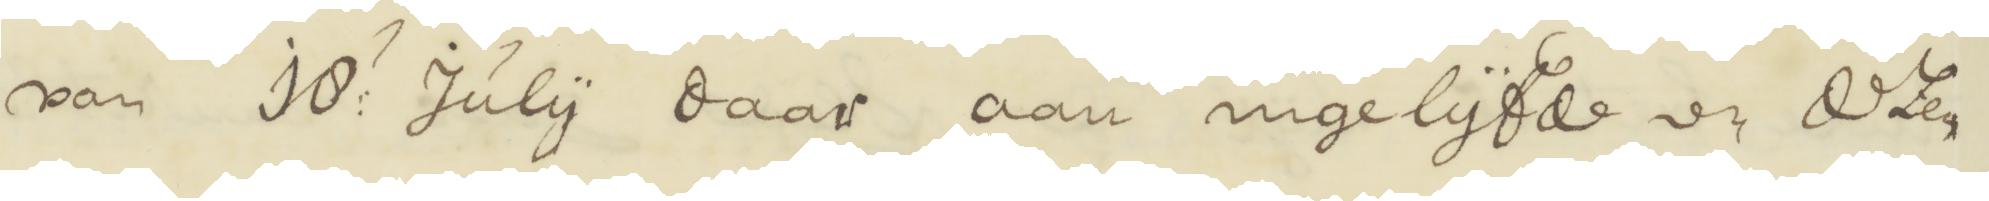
van 18: Julij daar aan ingelijfde en dezen
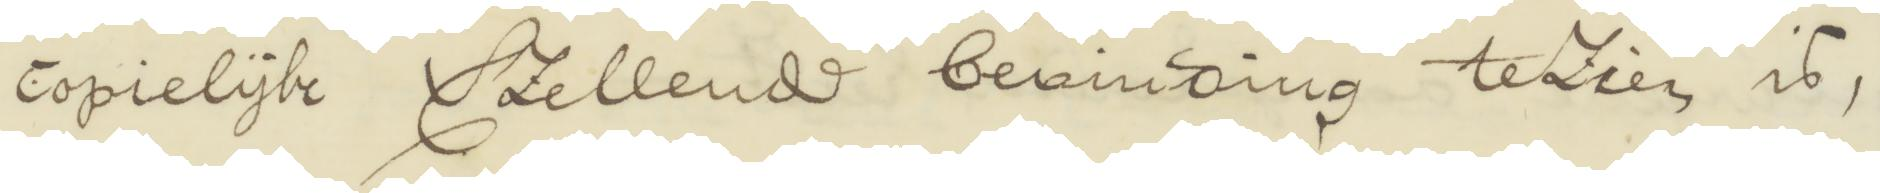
copielijk verzellende bevinding te zien is,
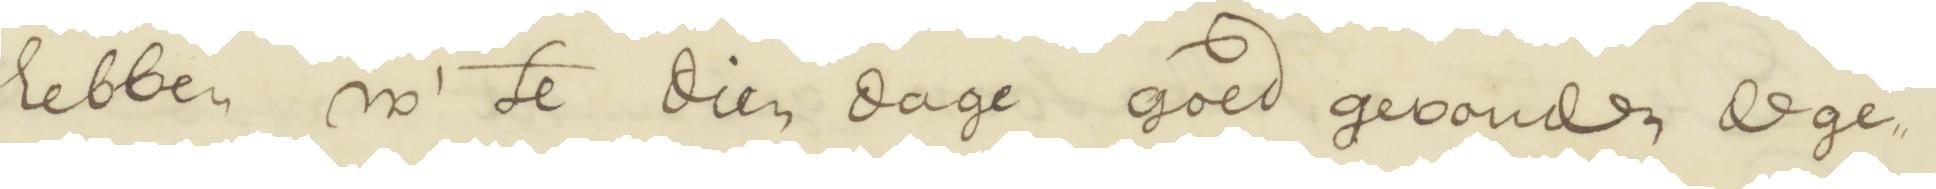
hebben w' te dien dage goed gevonden de ge„
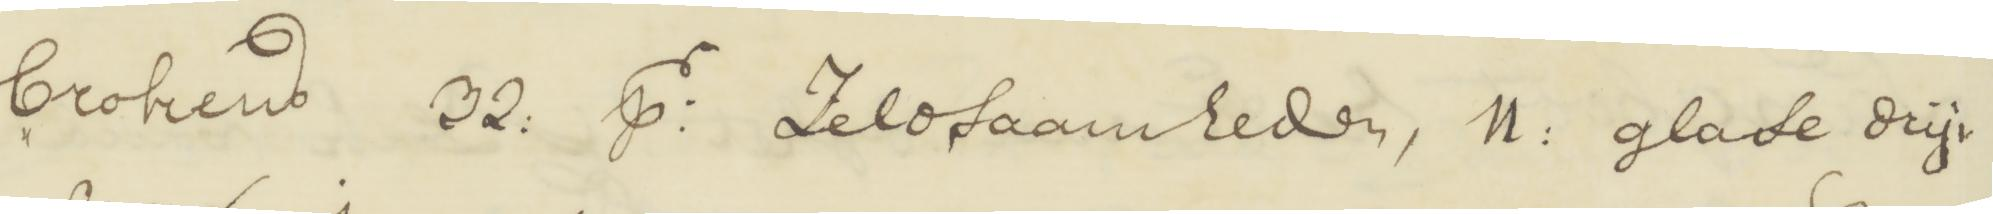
brokens 32: p:s Zeldsaamheden, 11: glase drij„
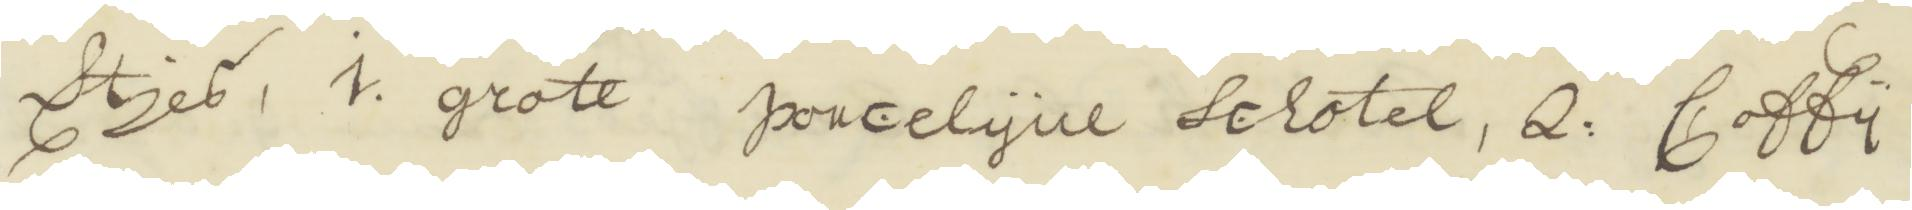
vertjes, 1. grote porcelijne schotel, 2: Coffij
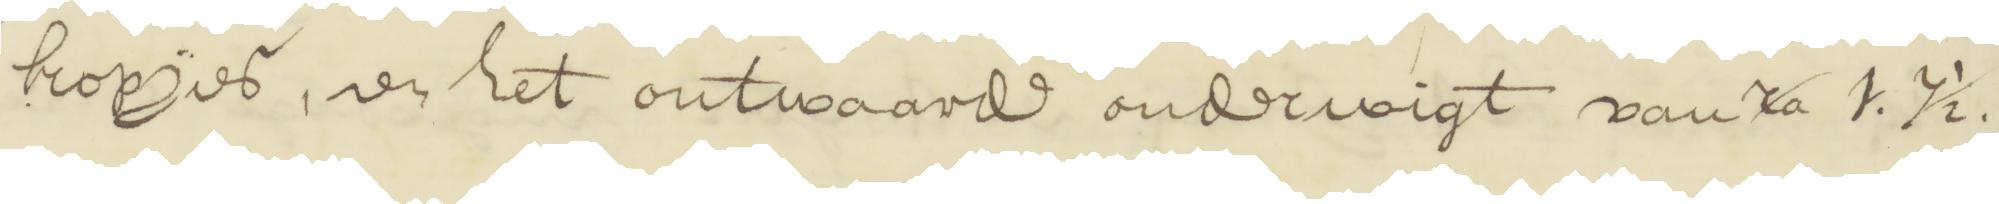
kopjes, en het ontwaarde onderwigt van r/a 1.7½.
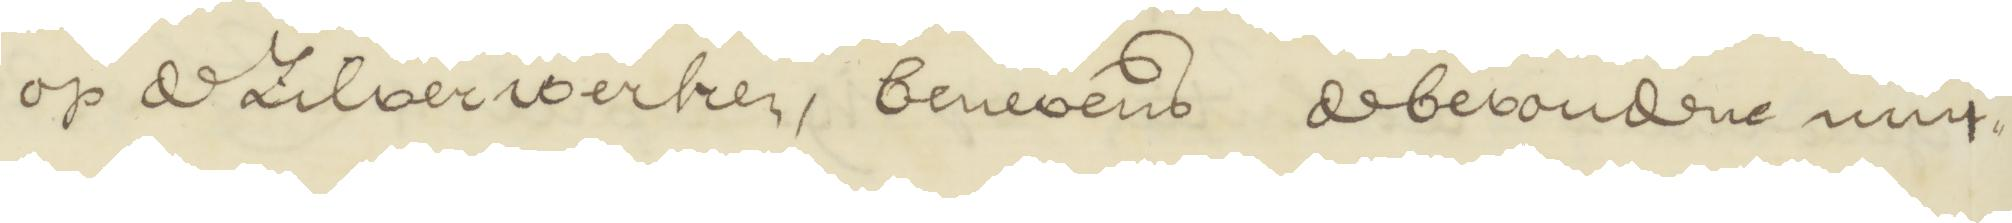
op de zilverwerken, benevens de bevondene min„
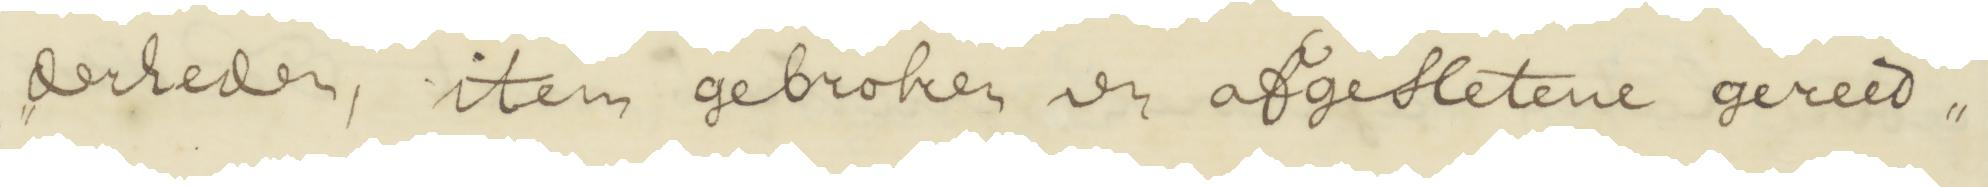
„derheden, item gebroken en afgesletene gereed„
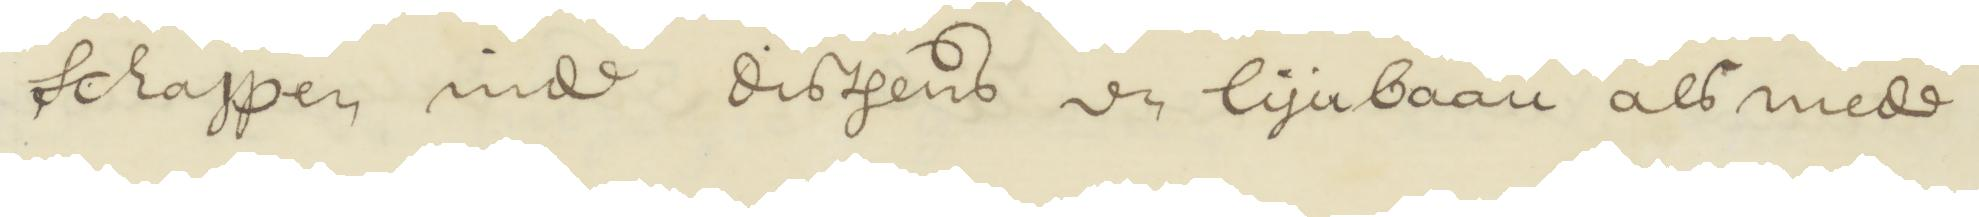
schappen inde dispens en lijnbaan als mede
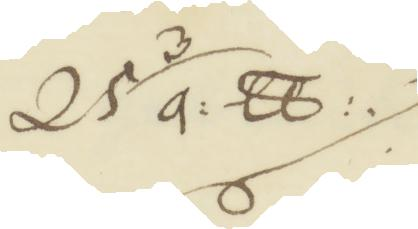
25¾. lb:./
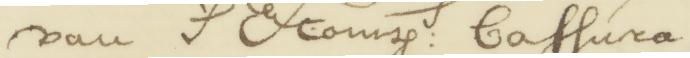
van ’s Ecomp:s bassura
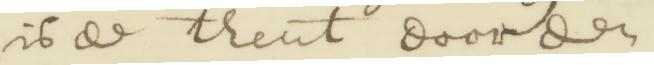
is de thent door den
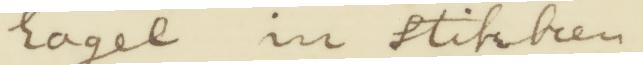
hagel in stikken
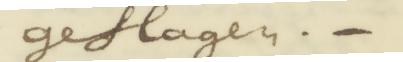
geslagen. -
